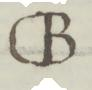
CB
